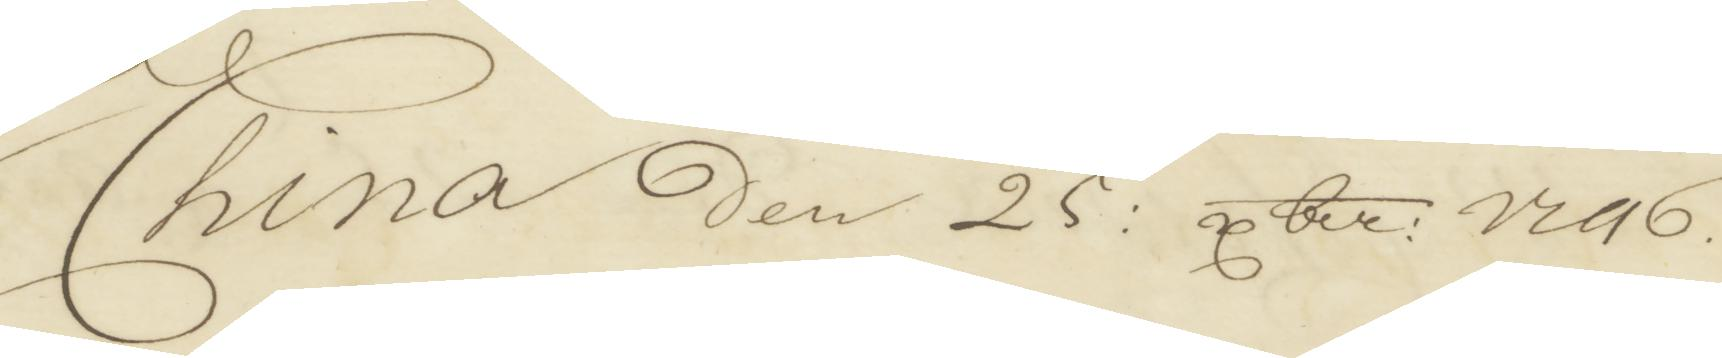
Van China den 25:' xbr: 1746.
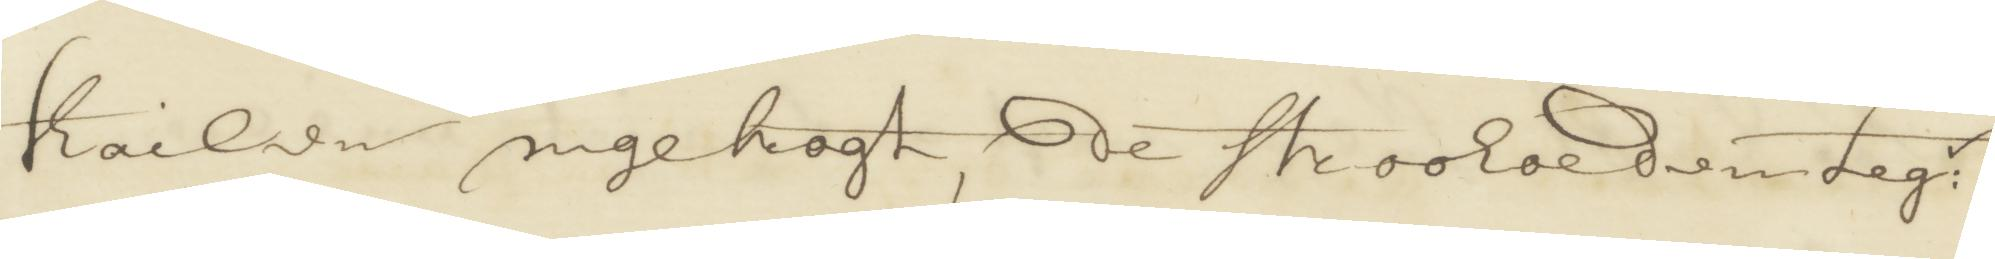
thailen ingekogt, de stroohoeden teg:s
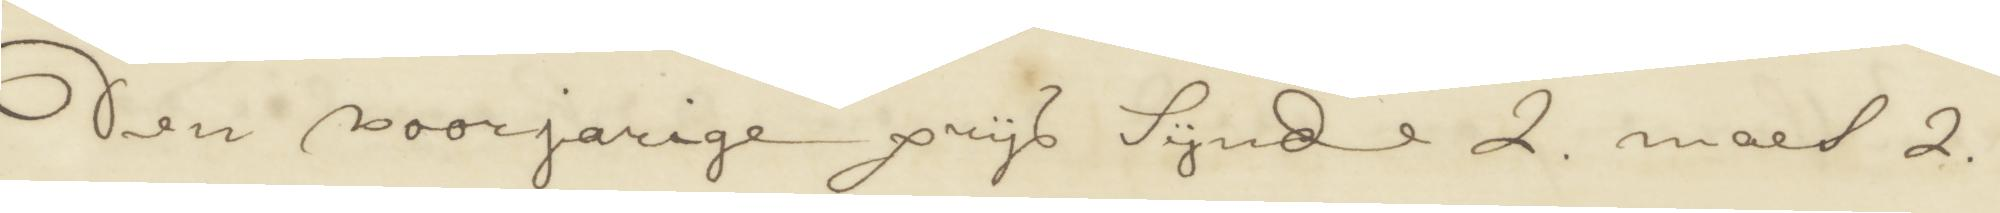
den voorjarige prijs sijnde 2. maes 2.
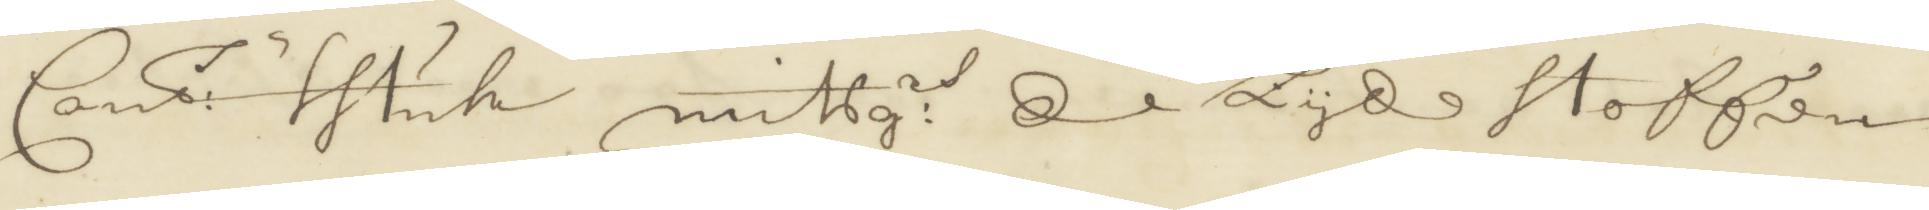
Cant:s 't stuk mitsg:rs de zijde stoffen
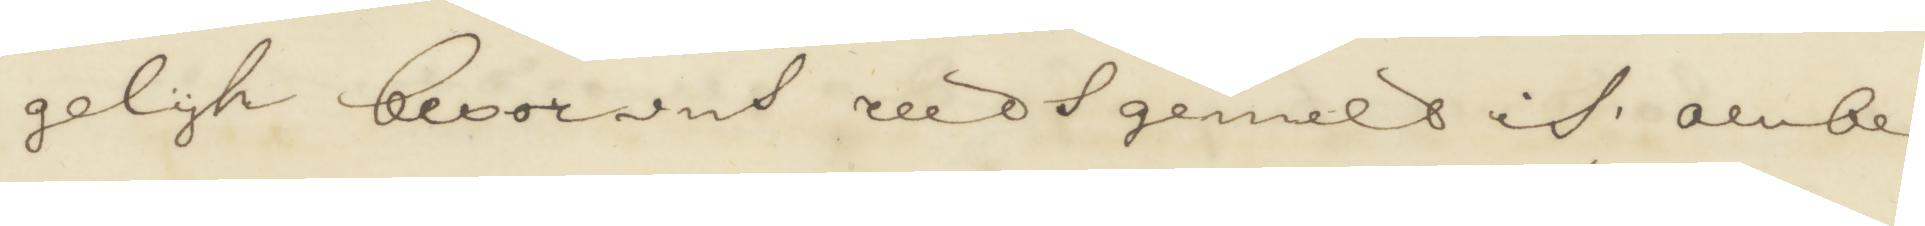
gelijk bevorens reeds gemeld is; aen be
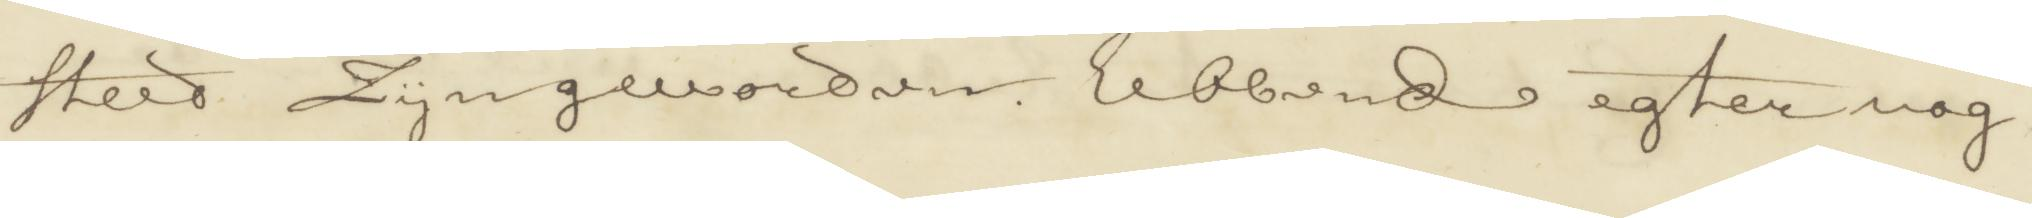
steed zijn geworden. hebbende egter nog
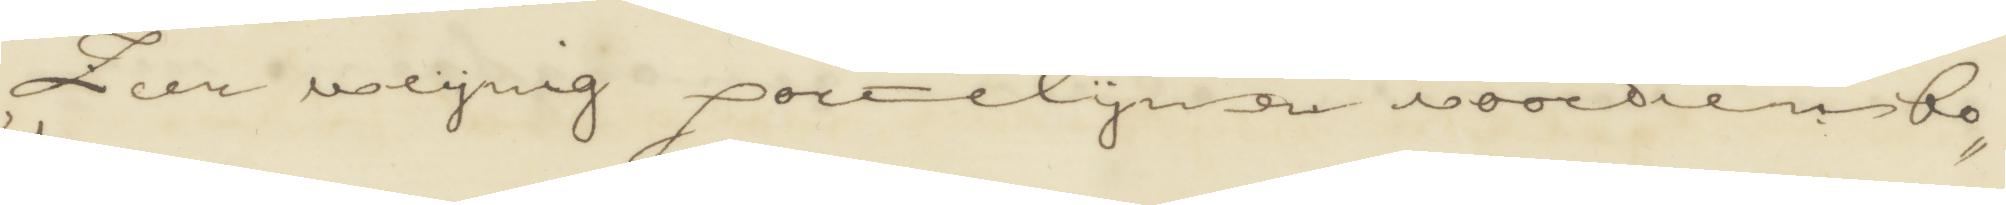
zeer weijnig porcelijnen voordien bo„
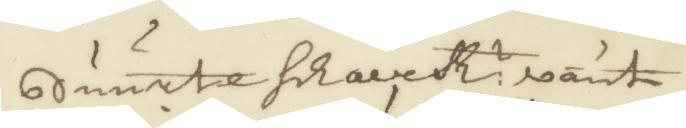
duurte schaersh:t van ’t
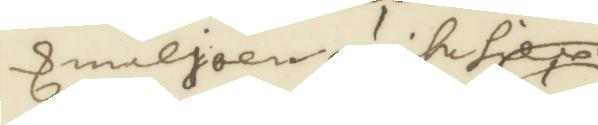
vermiljoen quiksilver
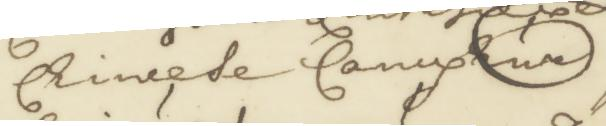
Chineese Camphur
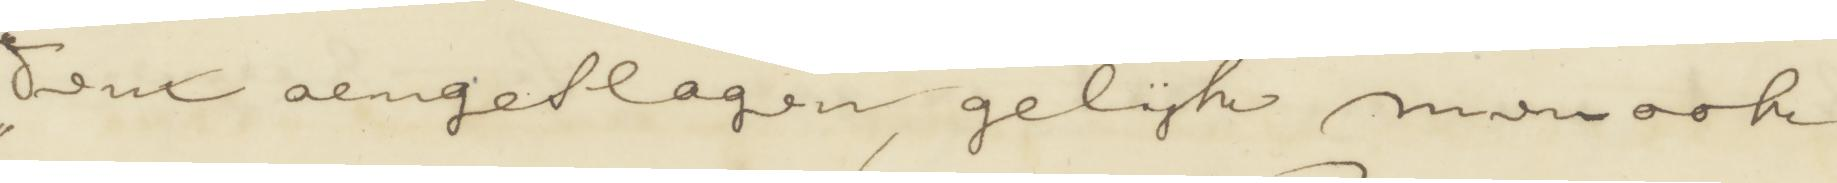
„dent aengeslagen, gelijk men ook
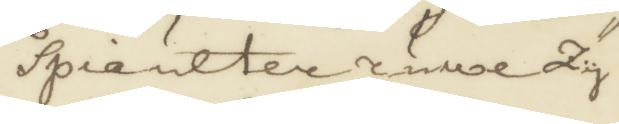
spiaulter ruwe zij
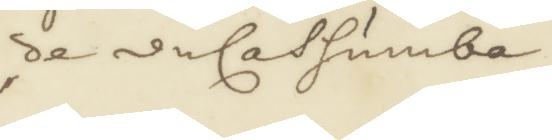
„de en Cassumba
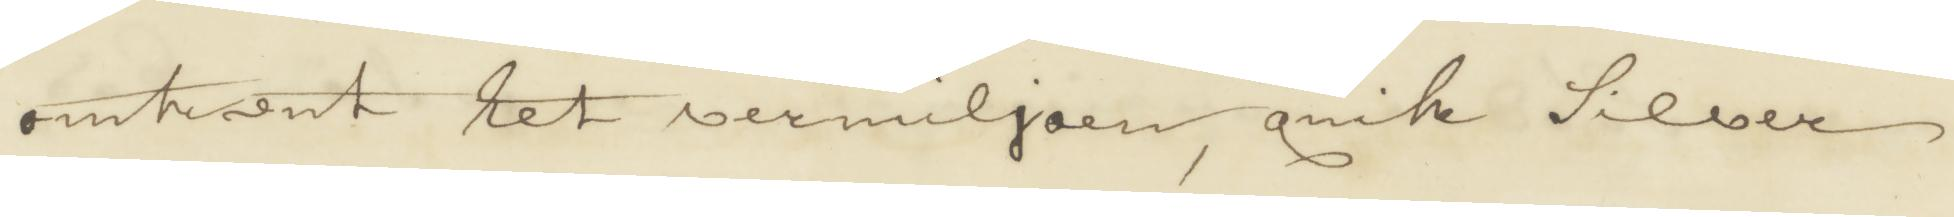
omtrent het vermiljoen, quik silver
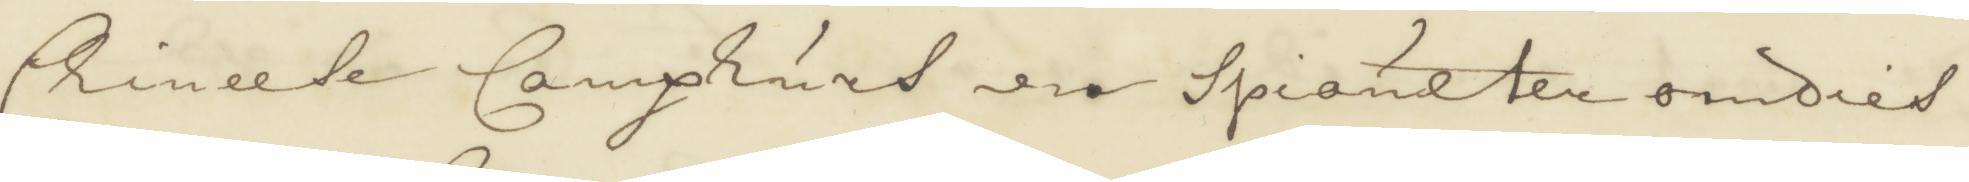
Chineese Camphurs en spiaulter omdies
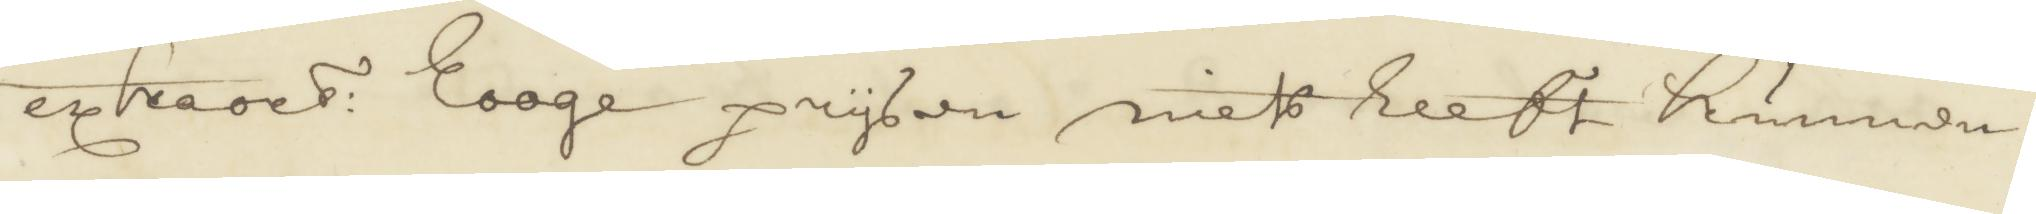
extraord: hooge prijsen niets heeft kunnen
